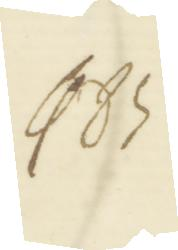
485
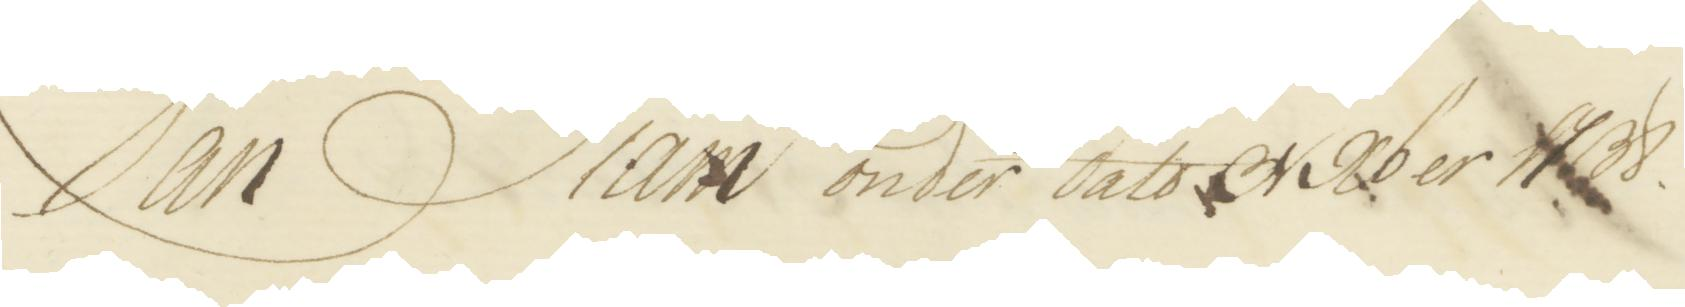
Van Siam onder dato 31 xber 1738.
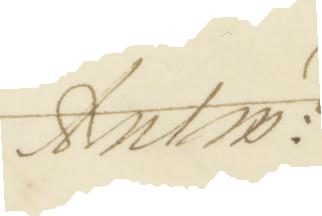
Antw:
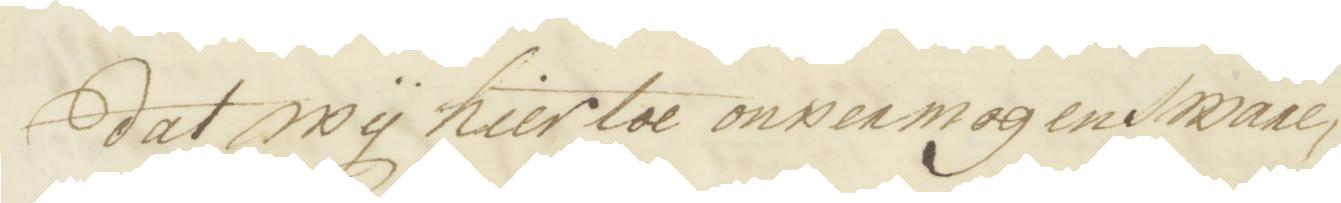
dat wij hiertoe onvermogens ware,
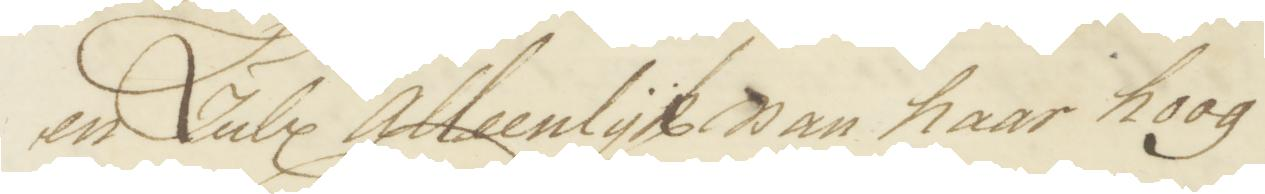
en Zulx Alleenlijk van haar hoog
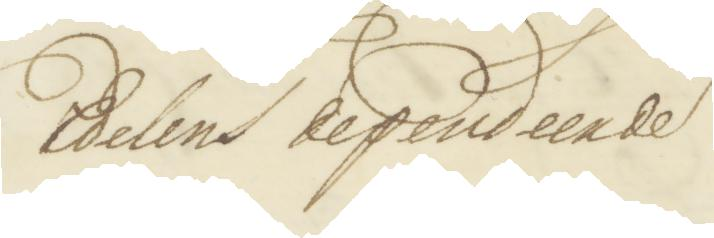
Edelens dependeerde
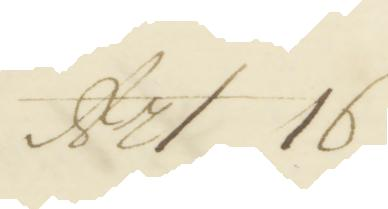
Art 16
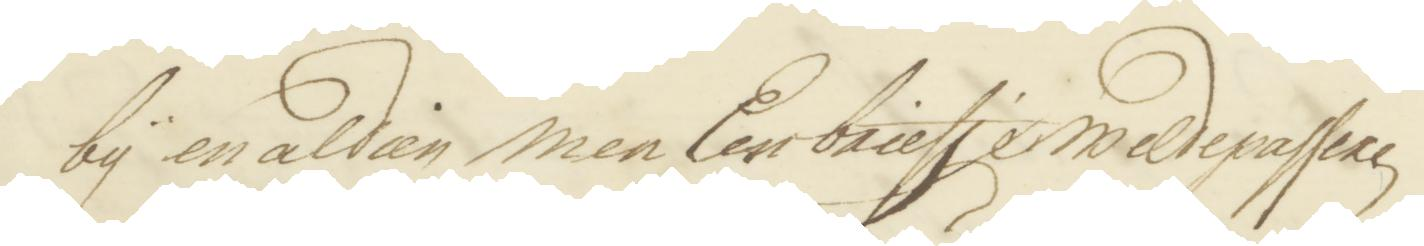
bij en aldien men Een briefje melde passeren
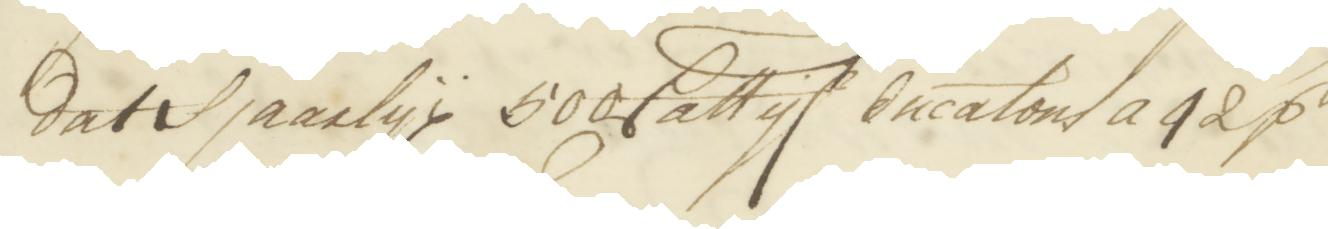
dat sjaarlijx 500 Cattijs ducatons a 42 p
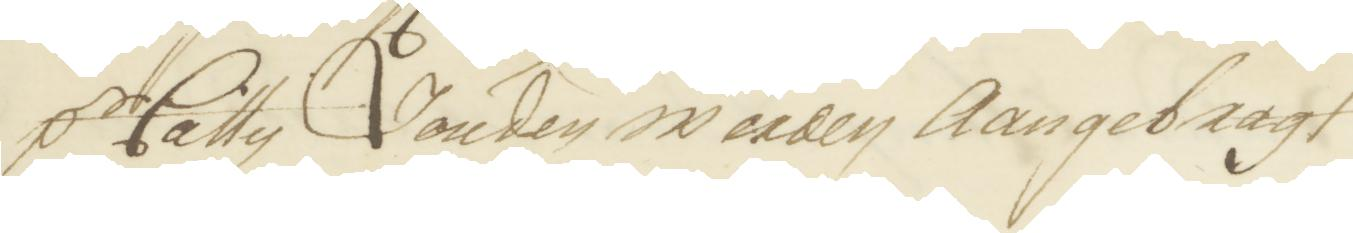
ps Catty Zouden werden Aangebragt
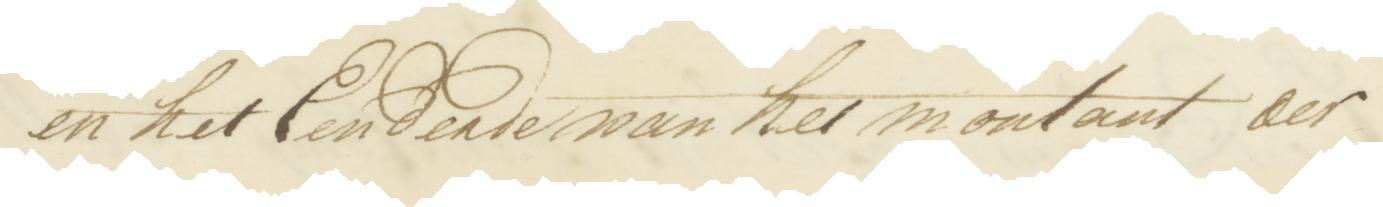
en het Een derde van het montant der
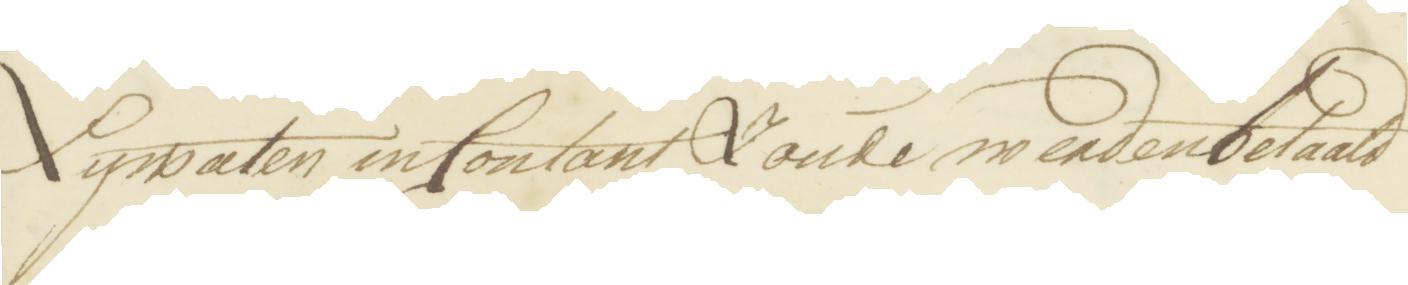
Lywaten in Contant Zoude werden betaald
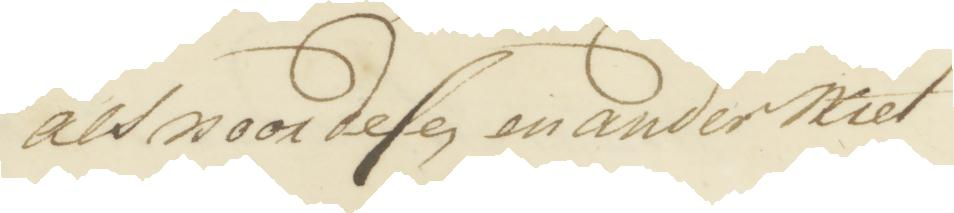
als voor desen en ander niet
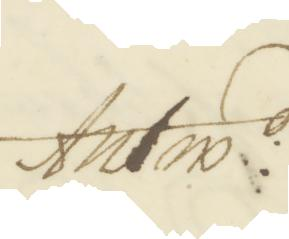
Antw
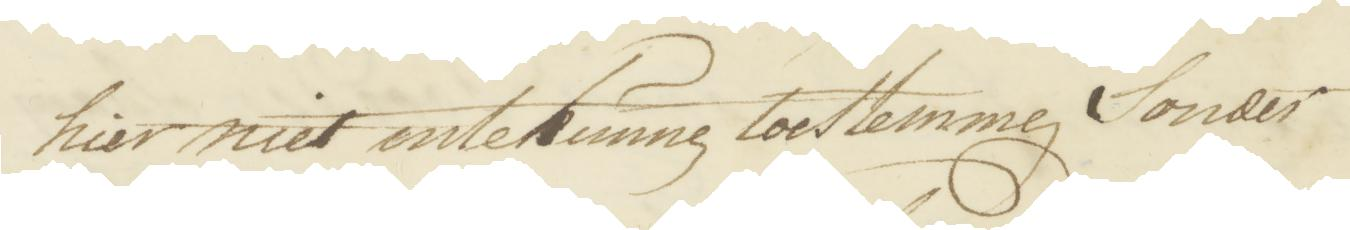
hier niet en te kunnen toestemmen sonder
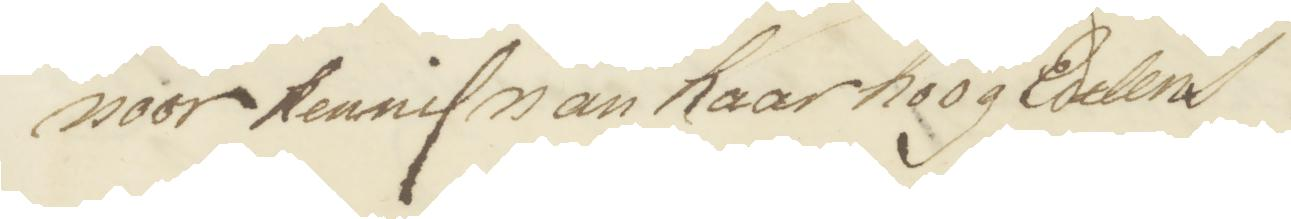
voorkennis van haar hoog Edelens
